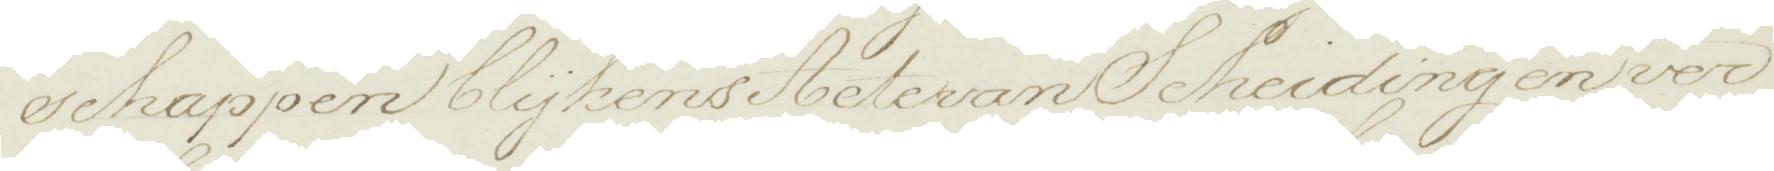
schappen blijkens Acte van Scheiding en ver
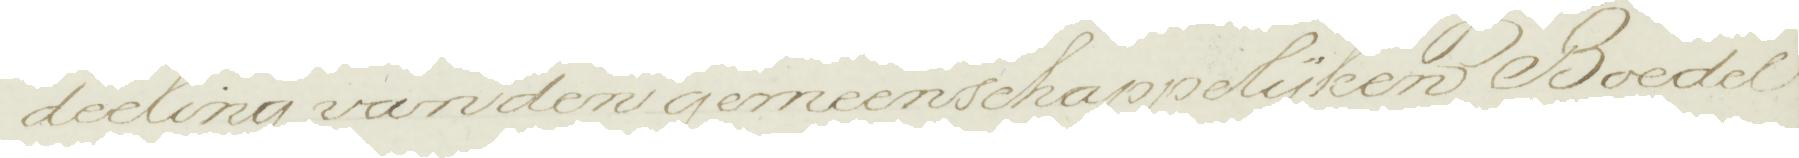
deeling van den gemeenschappelijken Boedel
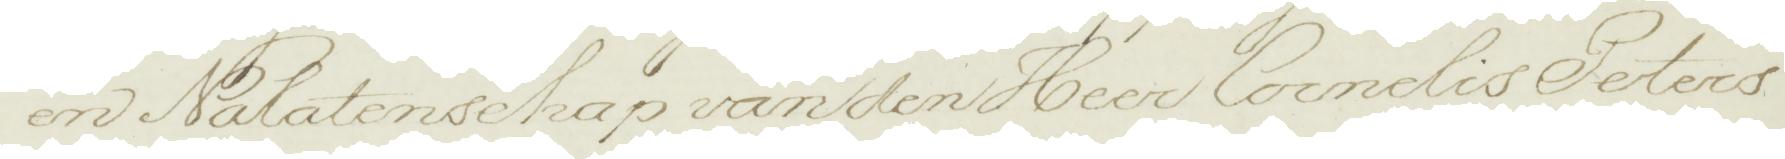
en Nalatenschap van den Heer Cornelis Peters
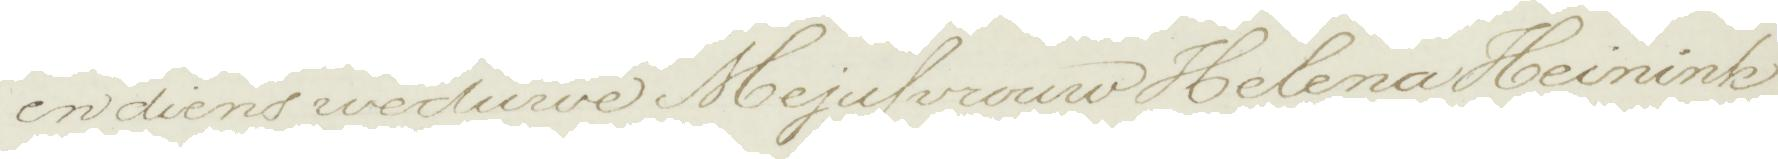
en diens weduwe Mejufvrouw Helena Heinink
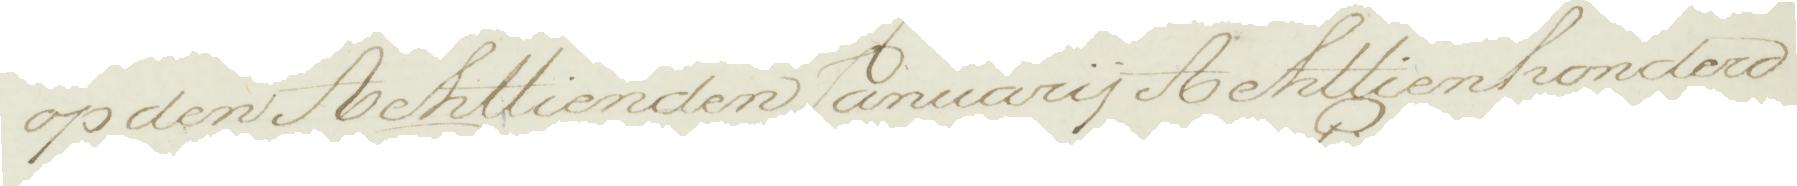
op den Achttienden Januarij Achttienhonderd
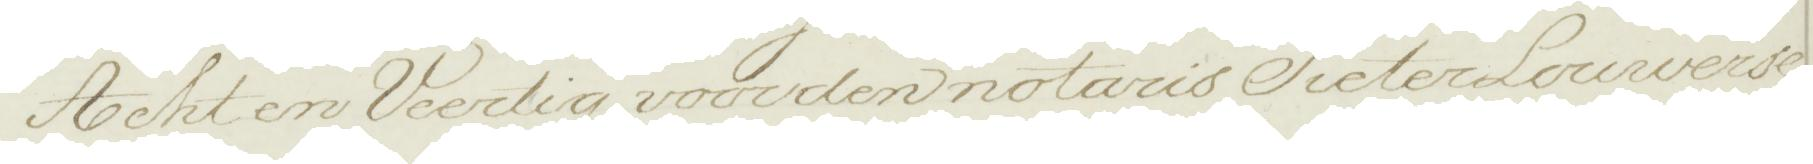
Acht en Veertig voor den notaris Pieter Louwerse
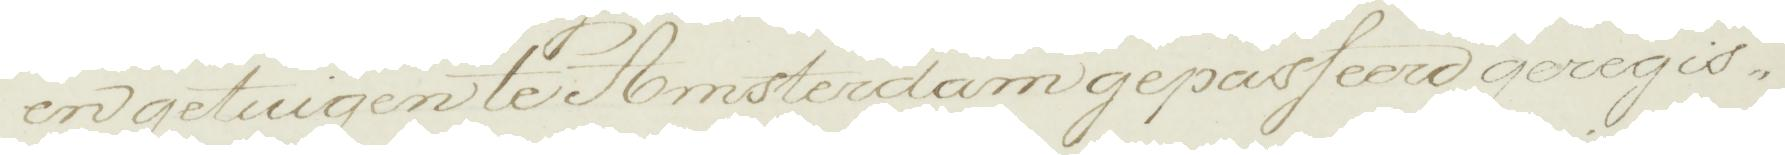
en getuigen te Amsterdam gepasseerd geregis„
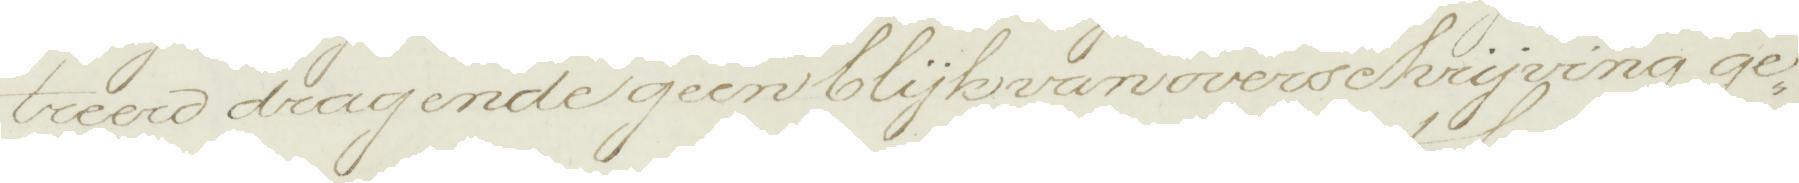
treerd dragende geen blijk van overschrijving ge„
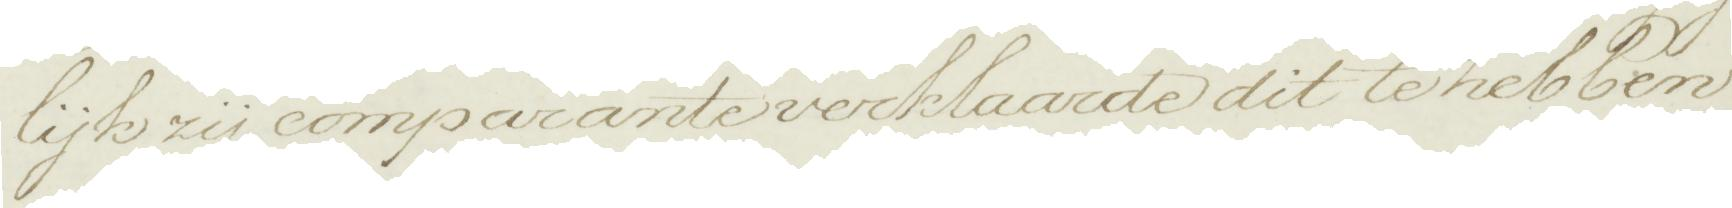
lijk zij comparante verklaarde dit te hebben
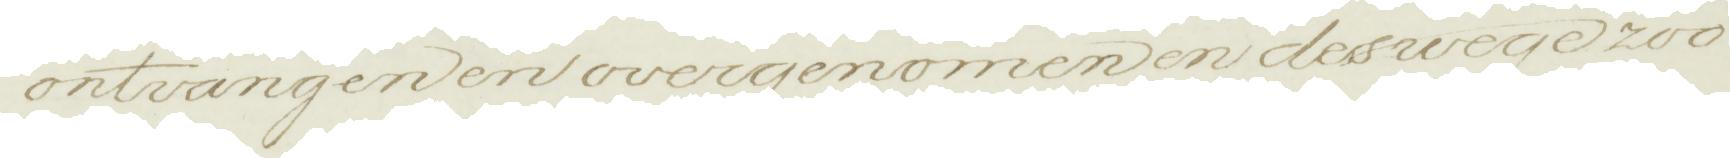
ontvangen en overgenomen en deswege zoo
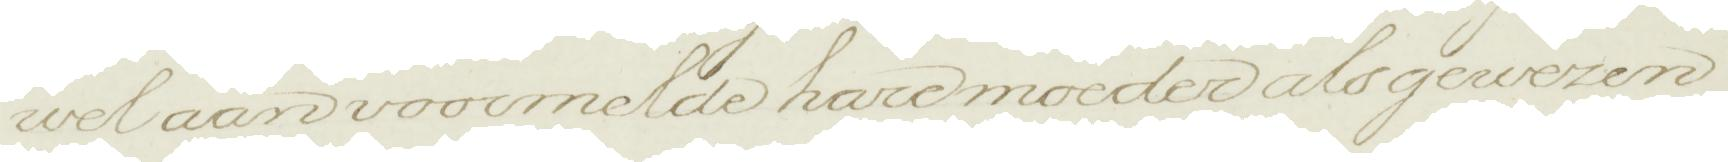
wel aan voormelde hare moeder als gewezen
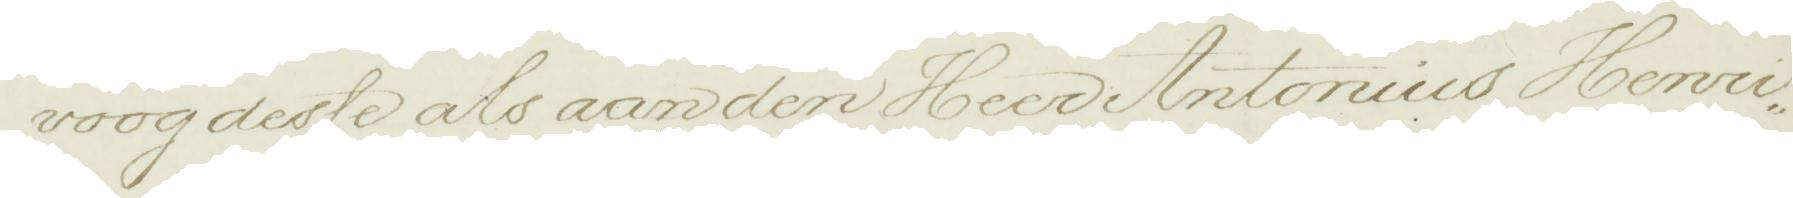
voogdesse als aan den Heer Antonius Henri„
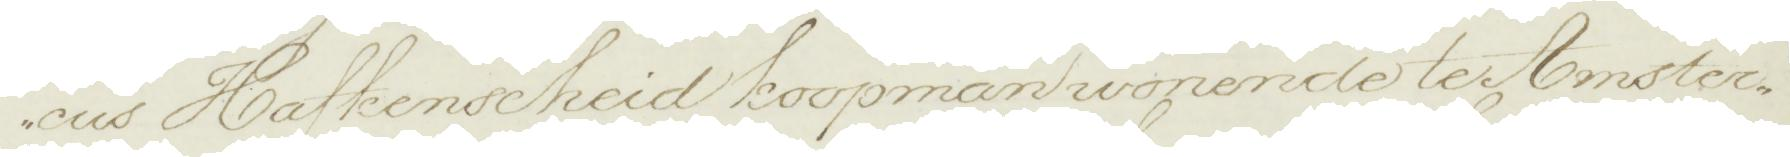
„cus Hafkenscheid koopman wonende te Amster„
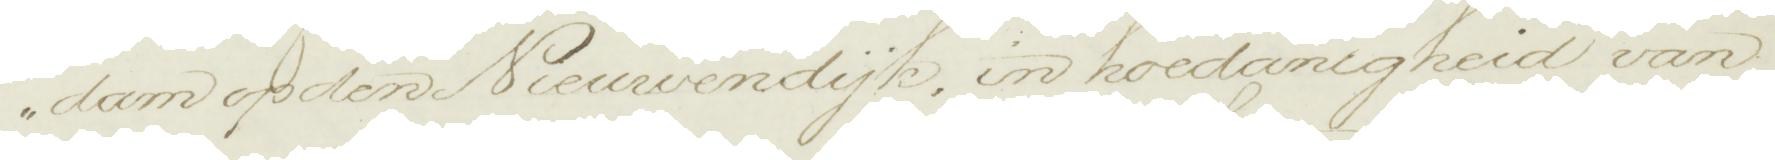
„dam op den Nieuwendijk, in hoedanigheid van
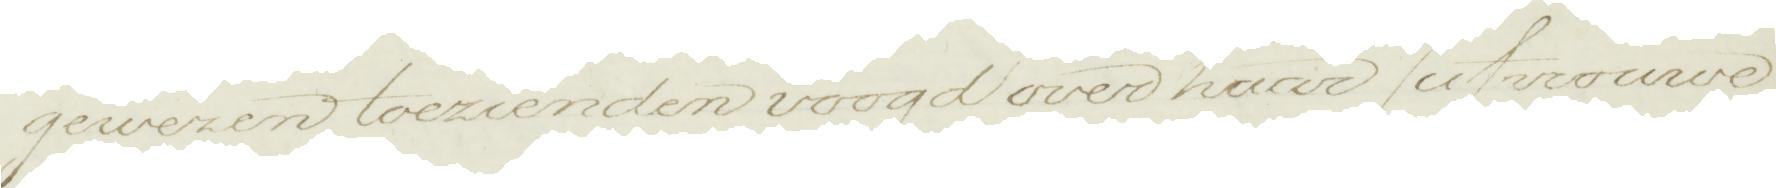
gewezen toezienden voogd over haar Jufvrouwe
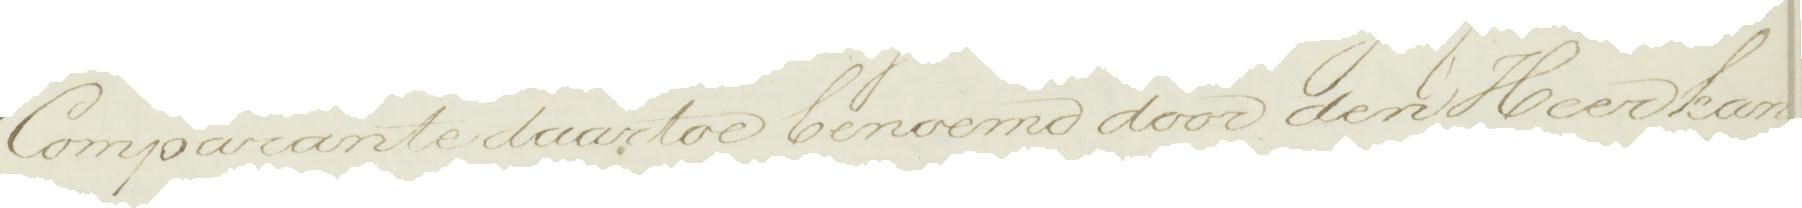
Comparante daartoe benoemd door den Heer kan
